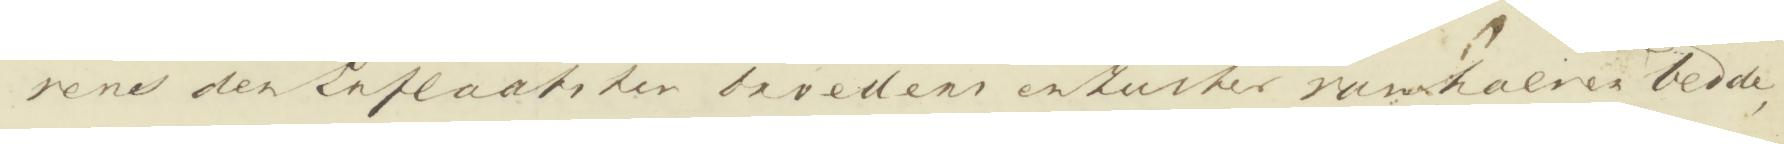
vens der Erflaatster broeders en zuster van halven bedde,
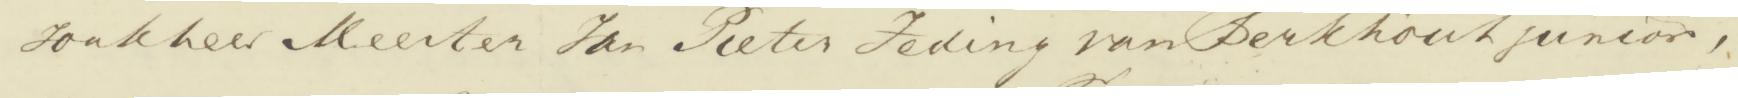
Ionkheer Meester Ian Pieter Teding van Berkhout junior,
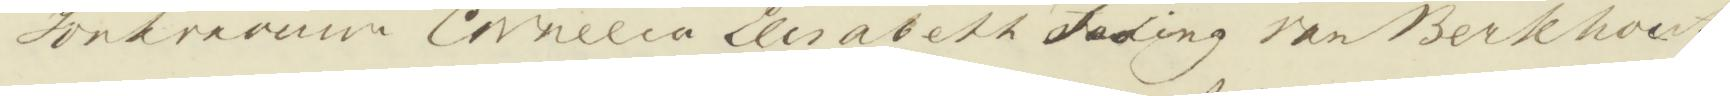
Ionkvrouwe Cornelia Elisabeth Teding van Berkhout
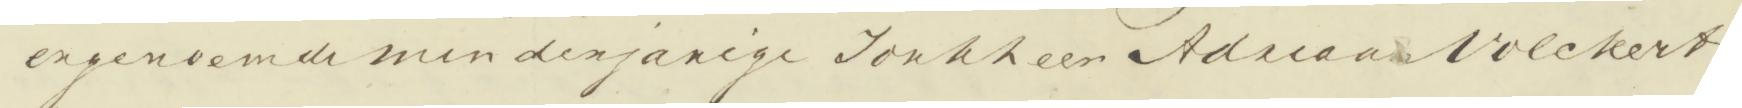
en genoemde minderjarige Ionkheer Adriaan Volckert
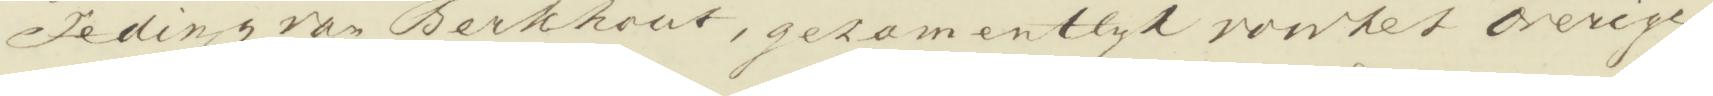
Teding van Berkhout, gezamentlyk voor het overige
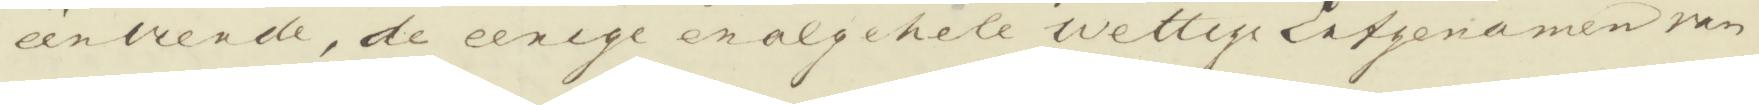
een vierde, de eenige en algehele wettige Erfgenamen van
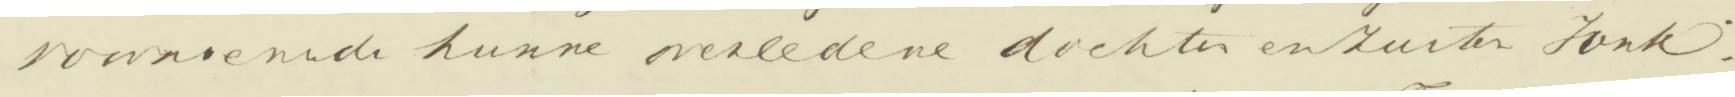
voornoemde hunne overledene dochter en zuster Ionk:
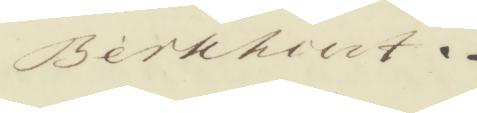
Berkhout.
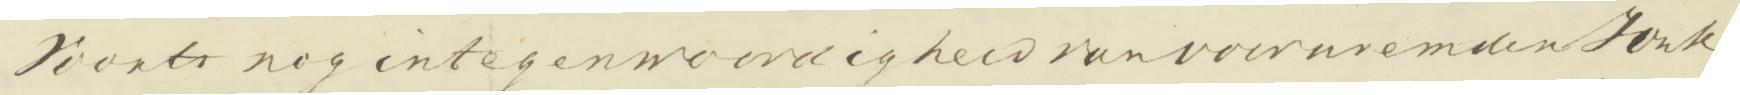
Voorts nog integenwoordigheid van voornoemden Ionk
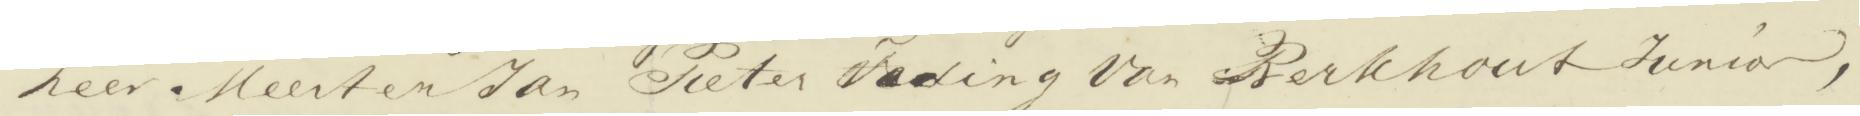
heer Meester Ian Pieter Teding van Berkhout Iunior,
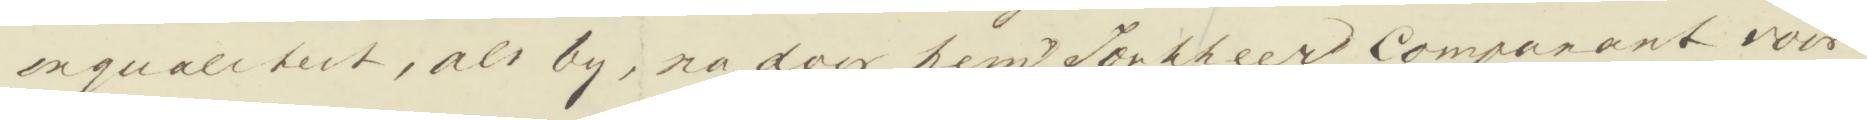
in qualiteit, als by, na door hem Ionkheer Comparant voor
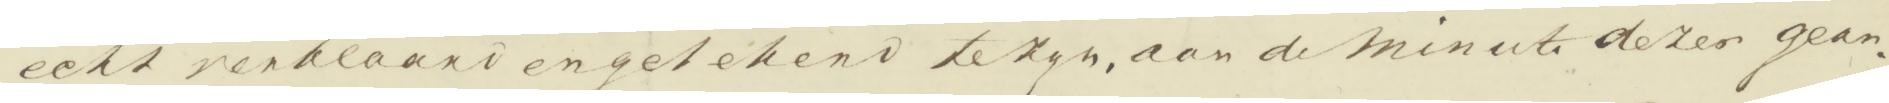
echt verklaard en getekend te zyn, aan de minute dezer gean„
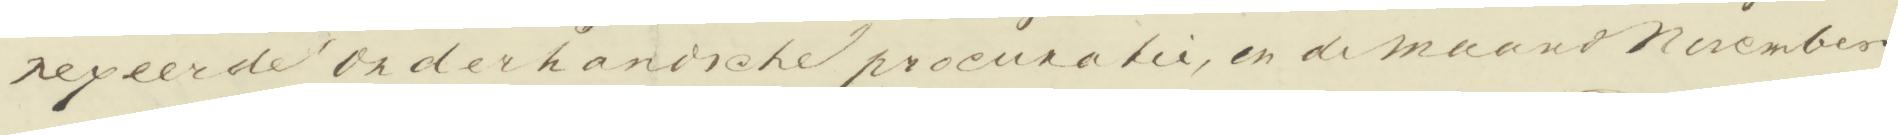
nexeerde onderhandsche procuratie, in de maand November
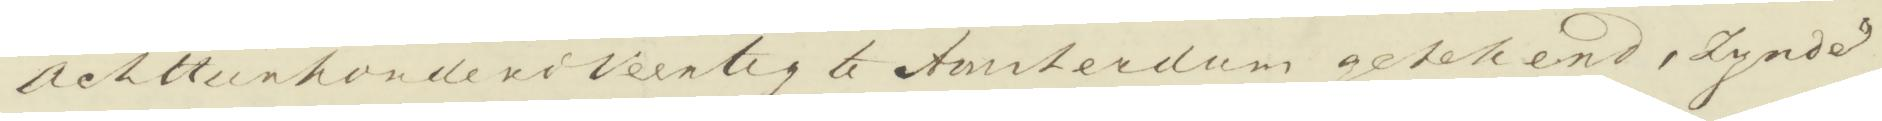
achttienhonderdveertig te Amsterdam getekend, zynde
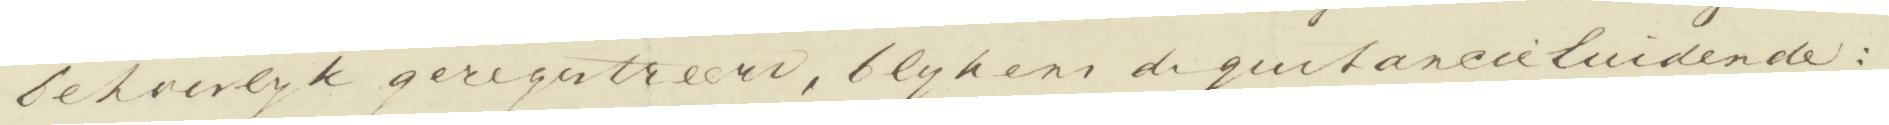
behoorlyk geregistreerd, blykens de quitancie luidende:
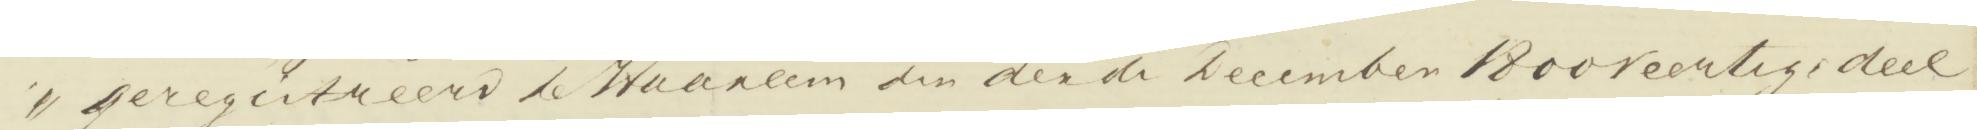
„ geregistreerd te Haarlem den derde December 1800veertig, deel
